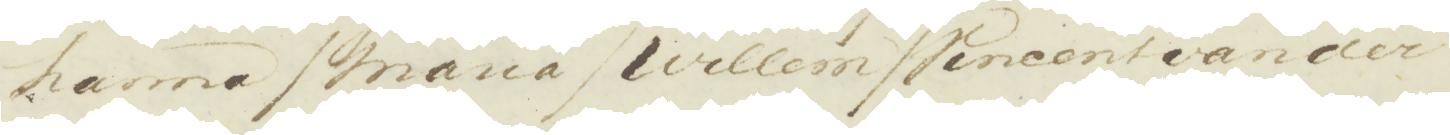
hanna / Maria / Willem / Vincent van der
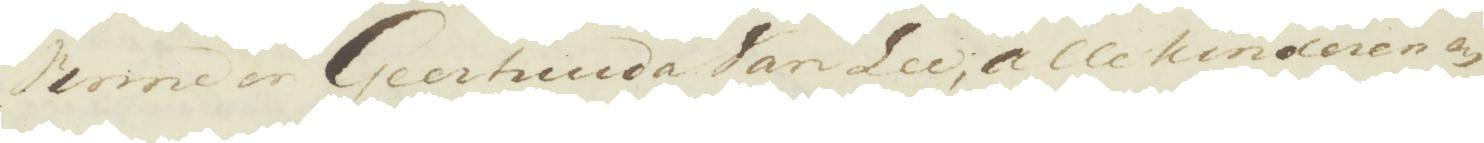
Vinnen en Geertruida van Lee, alle kinderen en
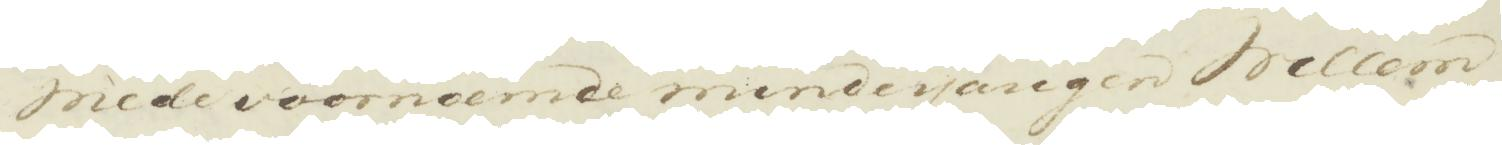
mede voornoemde minderjarigen Willem
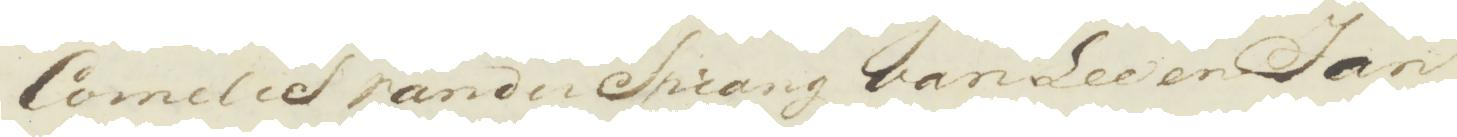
Cornelis van der Sprang van Lee en Jan
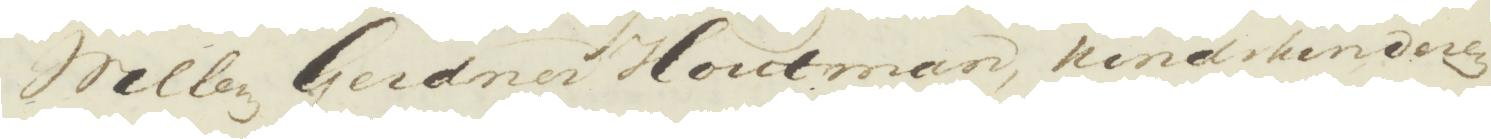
Willem Gerdner Houtman, kind & kinderen
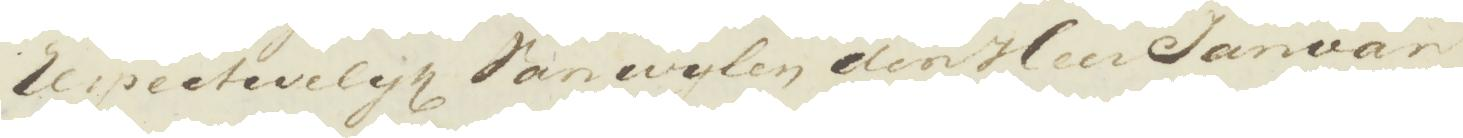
respectivelijk van wylen den Heer Janvan
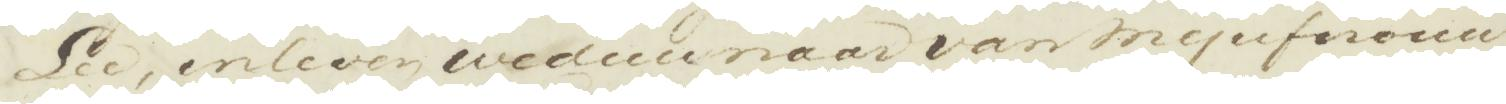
Lee, in leven weduwnaar van mejufvrouw
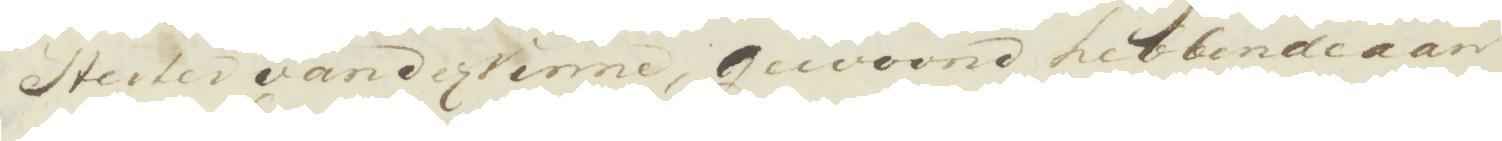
Hester van der Vinne, gewoond hebbende aan
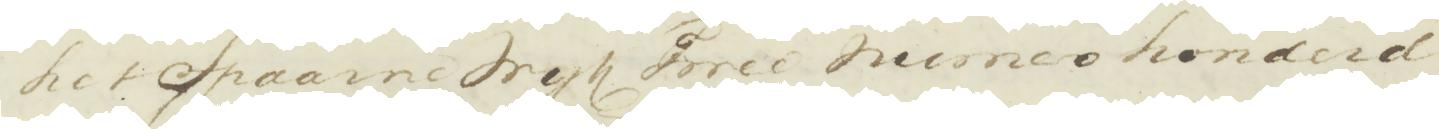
het Spaarne Wyk Twee Numero honderd
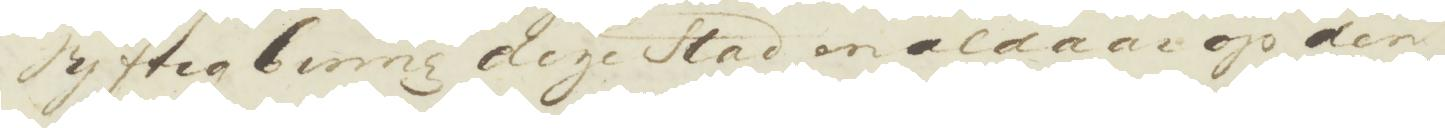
Vyftig binnen deze Stad en aldaar op den
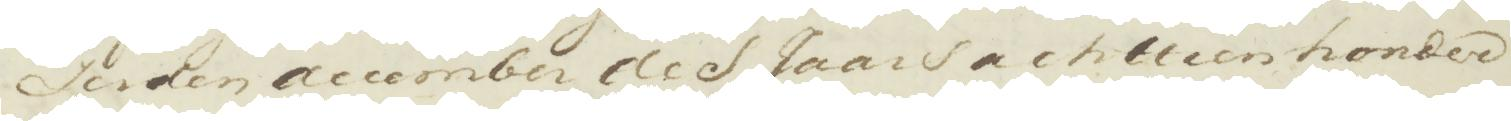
zesden december des Jaars achttien honderd
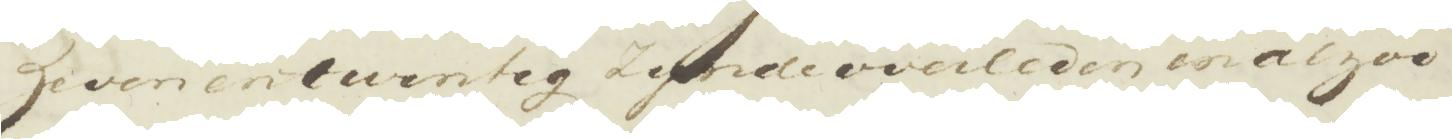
Zeven en twintig zynde overleden en alzoo
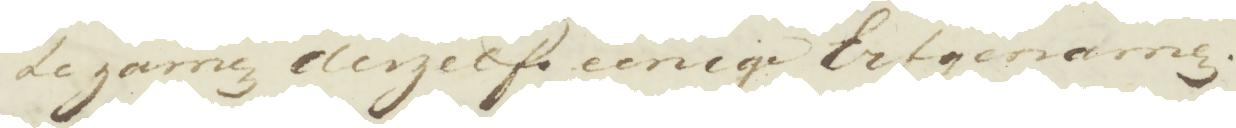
te zamen deszelfs eenige Erfgenamen
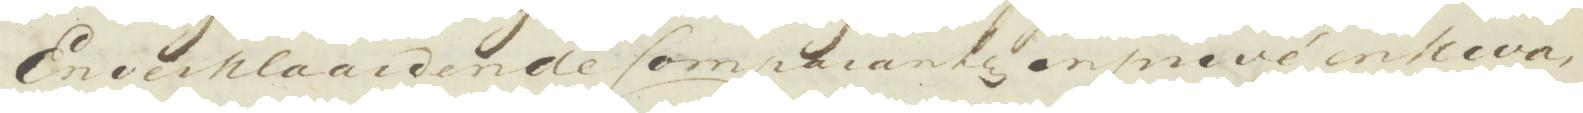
En verklaarden de Comparante in privé en kwa„
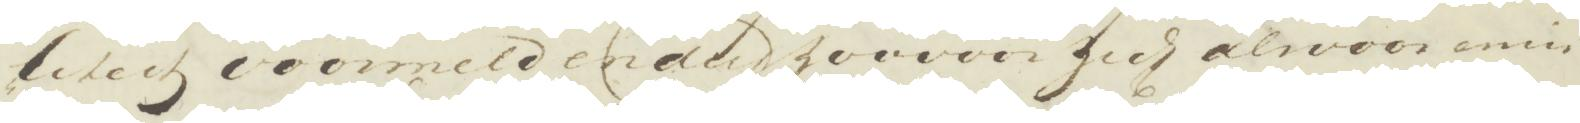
„liteit voormeld en dus zoovoor zich alsvoor enin
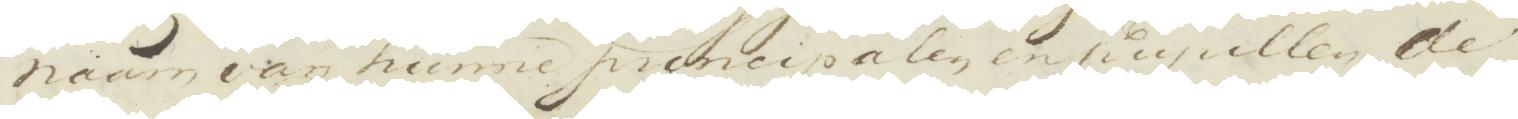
naam van hunne principalen en pupillen, de
